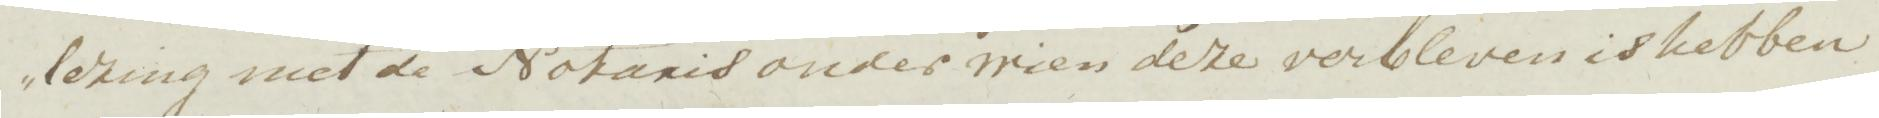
„lezing met de Notaris onder wien deze verbleven is hebben
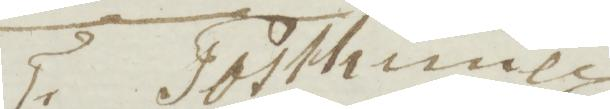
F Posthuma
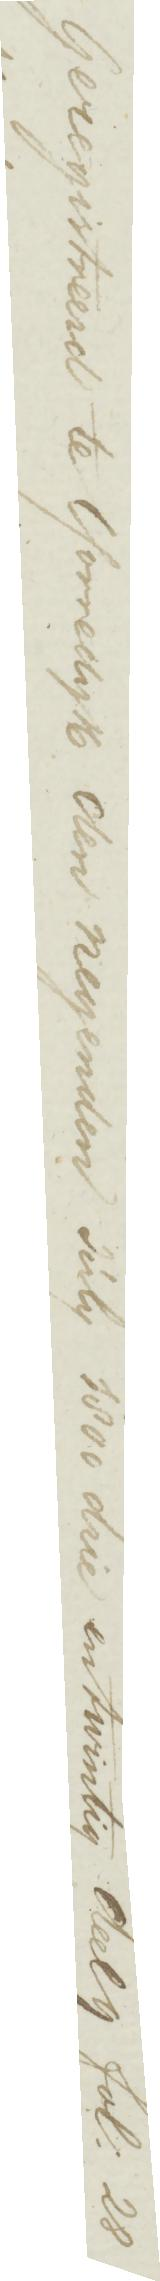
Geregistreerd te Gorredyk den negenden Iuly 1800 drie en twintig deel 9 fol: 28
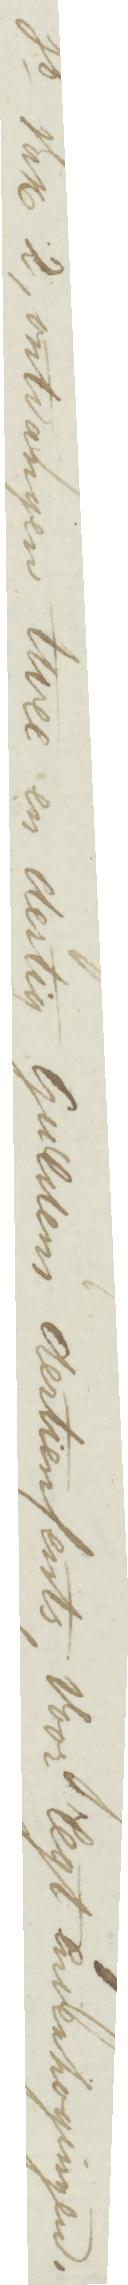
V-o Vak 2, ontvangen twee en dertig Guldens dertien Cents, voor regt enverhogingen.
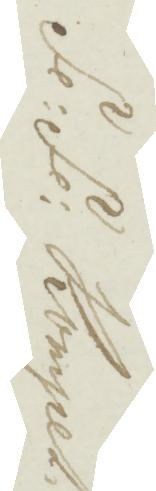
F: F: Kompet
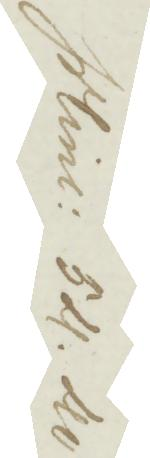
plinc: 54. 40
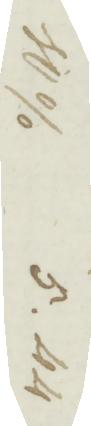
10% 5. 44
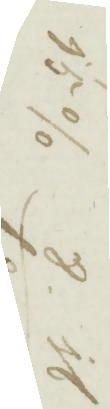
15% 8. 16
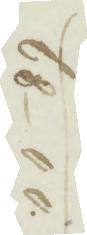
68 - 00.
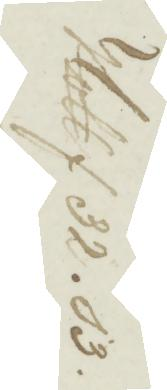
Holl ƒ 32.13.
